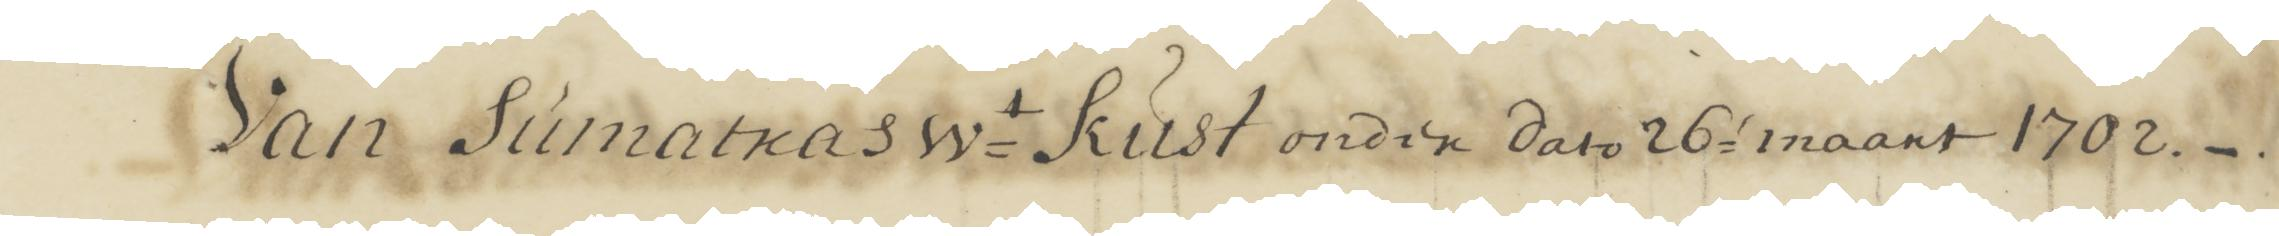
Van Sumatras w=t kust onder dato 26=' maart 1702. —.
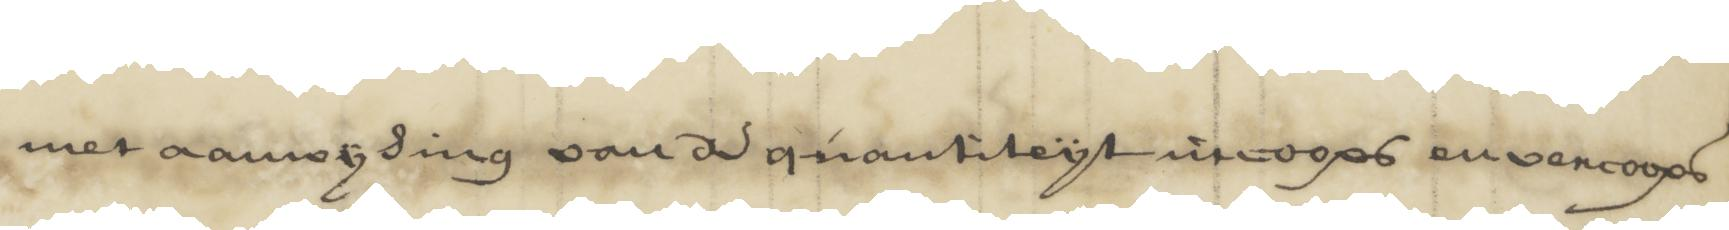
met aanwijsing van de quantiteijt incoops en vercoops
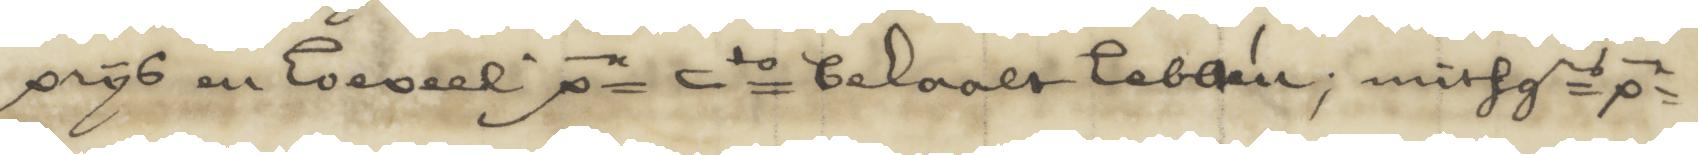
prijs en hoeveel p=r c=to behaalt hebben; mitsg=rs p=r
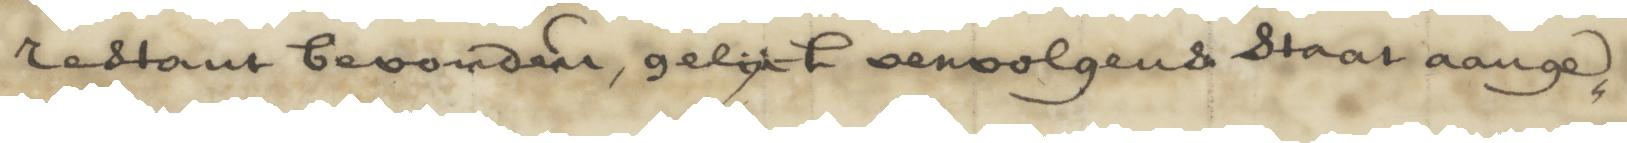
restant bevonden, gelijck vervolgens staat aange„
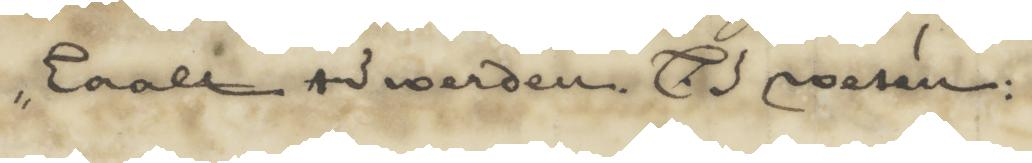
„haalt te werden. Te weten:
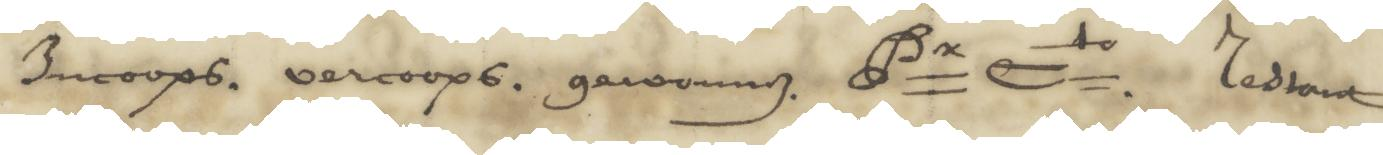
Incoops. vercoops. gewonnen. P=r c=to. restant
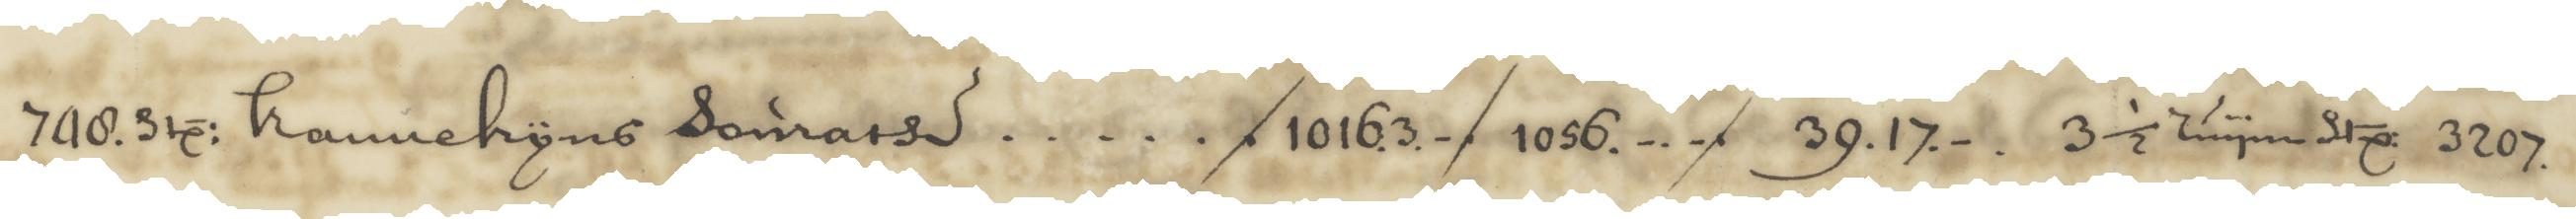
748. stx: kannekijns souratse . . . . . ƒ 1016. 3. — ƒ 1056. —. — ƒ 39.17. —. 3½ ruijm stx: 3207.
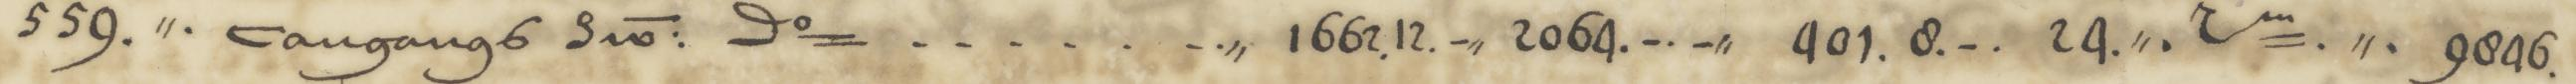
559. „. cangangs sw: d=o . . . . . . . „ 1662.12. — „ 2064. —. — „ 401.8. —. 24. „. r=m. „. 9846.
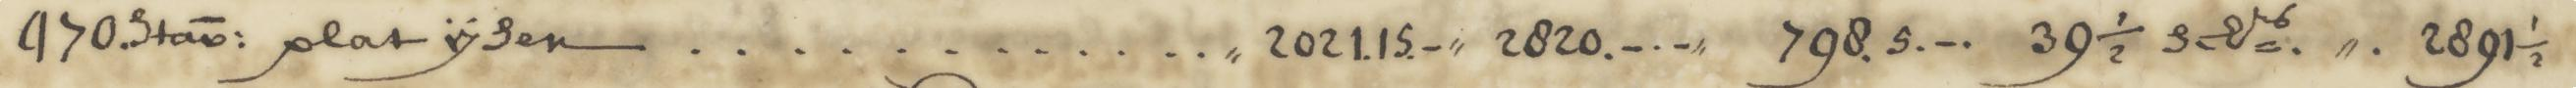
470. stav: plat ijser . . . . . . . . . . . . „ 2021.15. — „ 2820. —. — „ 798.5. —. 39½ sch=rs. „. 2891½
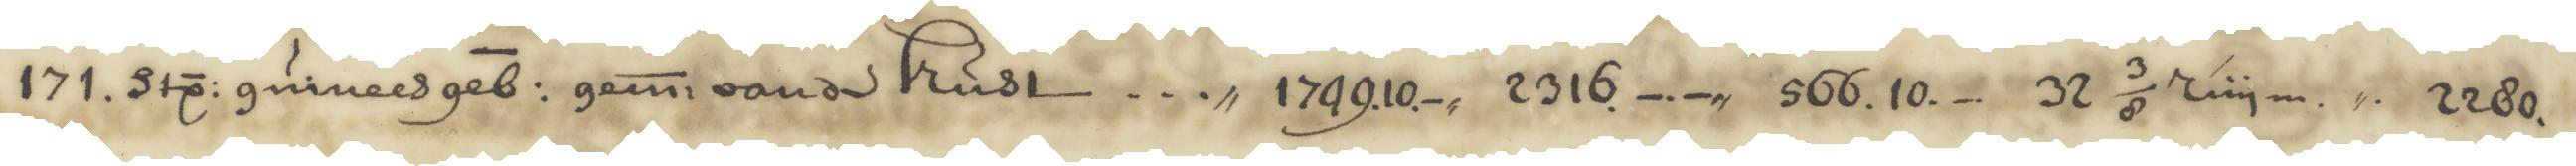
171. stx: guinees geb: gem: van de kust . . . „ 1749.10. — „ 2316. —. —„ 566.10. —. 32 3/8 ruijm. „. 2280.
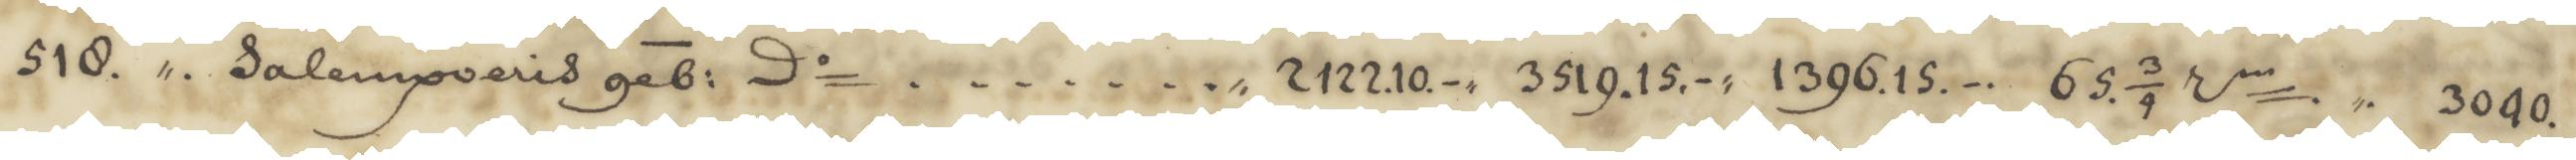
518. „. salempoeris geb: d=o . . . . . . . „ 2122.10. — „ 3519.15. — „1396.15. —. 65.3/4 r=m. „. 3040.
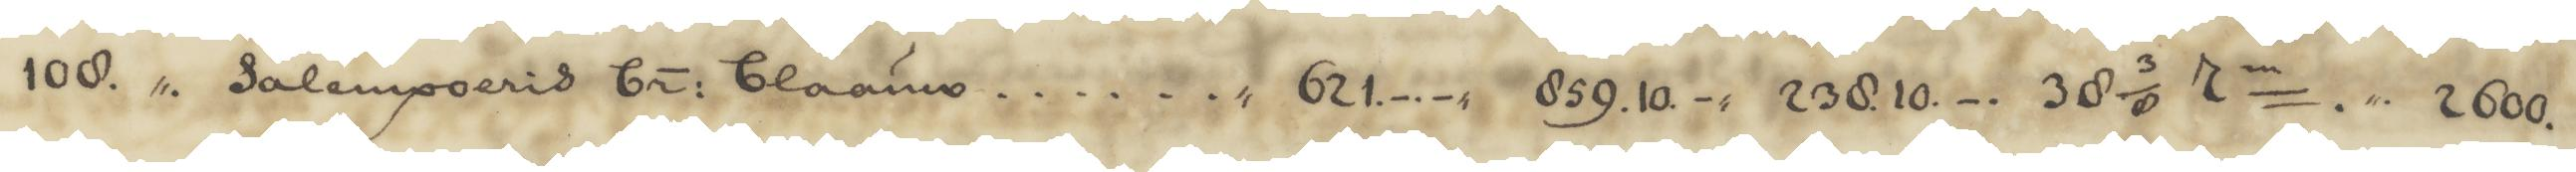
108. „. salempoeris br: blaauw . . . . . . „ 621. —. — „ 859.10. — „ 238.10. —. 38 3/8 r=m. „. 2600.
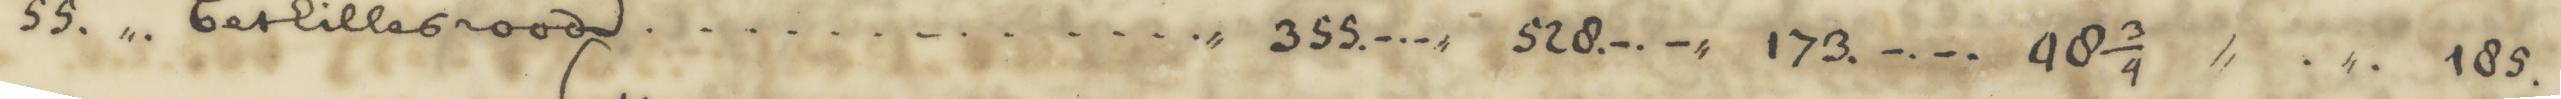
55. „. bethillesroode . . . . . . . . . . . . . „ 355. —. — „ 528. —. — „ 173. —. —. 48 3/4 „. „. 185.
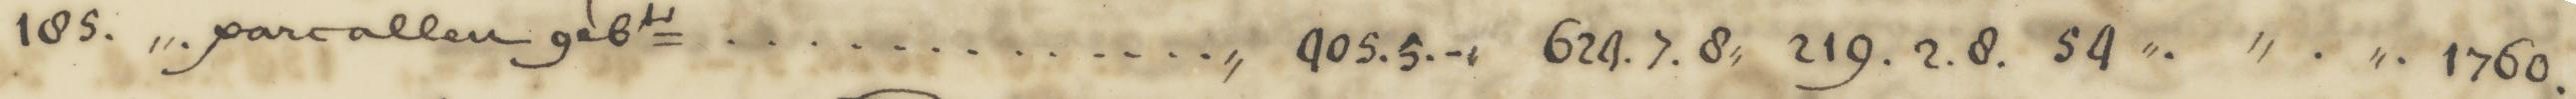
185. „. parcallen geb=te . . . . . . . . . . . . . . „ 405.5. — „ 624.7.8 „ 219.2.8. 54 „. „. „. 1760.
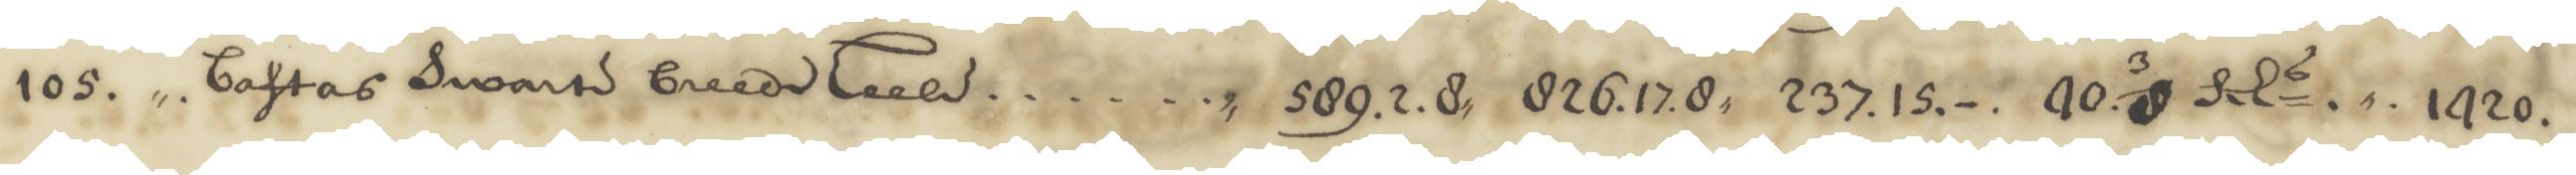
105. „. bastas swarte breede heele . . . . . . „ 589.2.8 „ 826.17.8 „ 237.15. —. 40.3/8 sch=s. „. 1420.
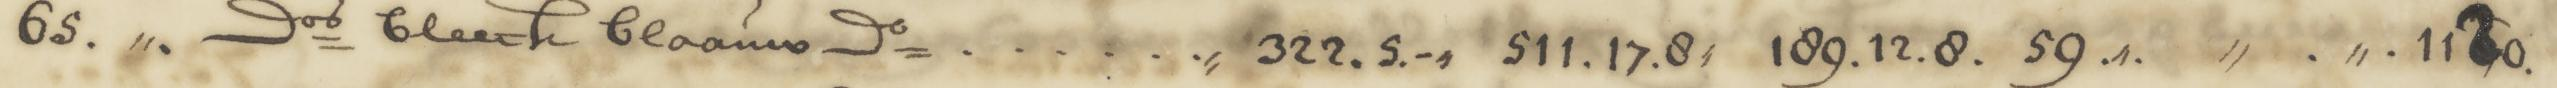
65. „. d=os bleeck blaauw d=o . . . . . . „ 322. 5. — „ 511.17. 8 „ 189.12.8. 59. „. „. „. 1120.
